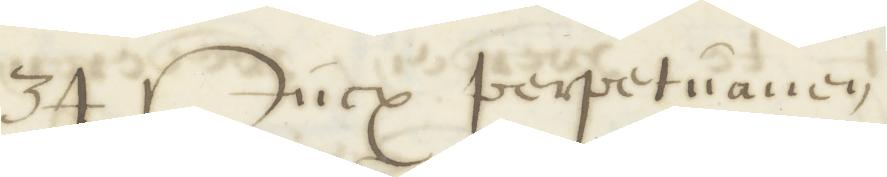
34 stucx perpetuanen
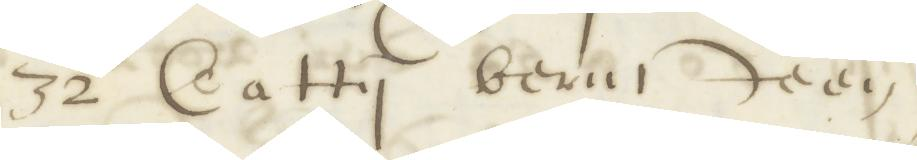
32 Cattij berusteen
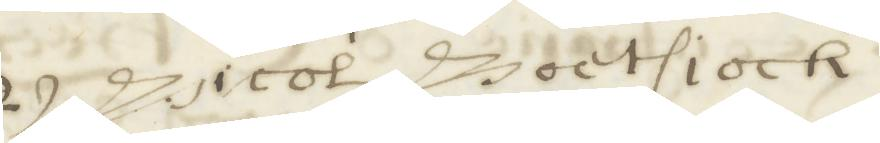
29 picol poetsiock
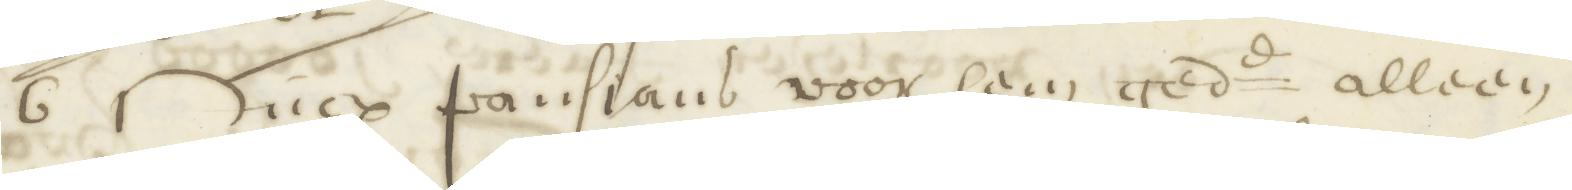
116 stucx pansians voor hem ged=e alleen
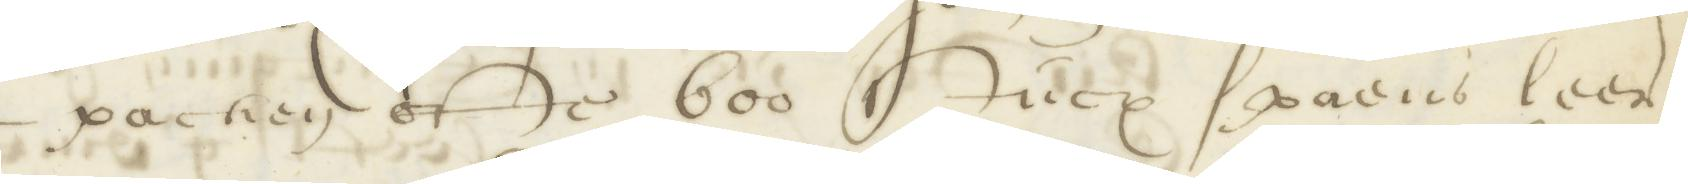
4 packen ofte 600 stucx spaens leer
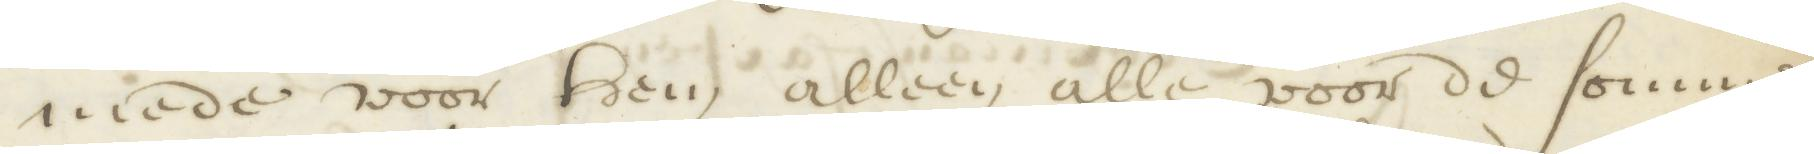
mede voor hem alleen alle voor de somme
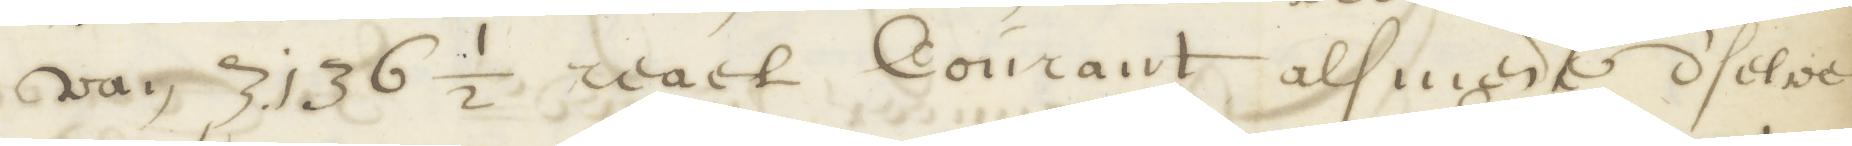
van 3136½ reael Courant alsmede d’selve
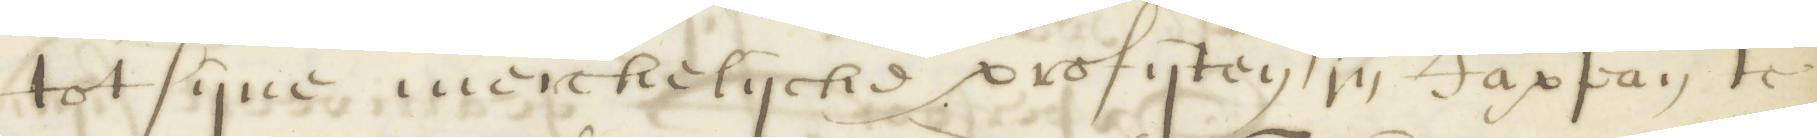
tot sijne merckelijcke profijten jn Iappan te
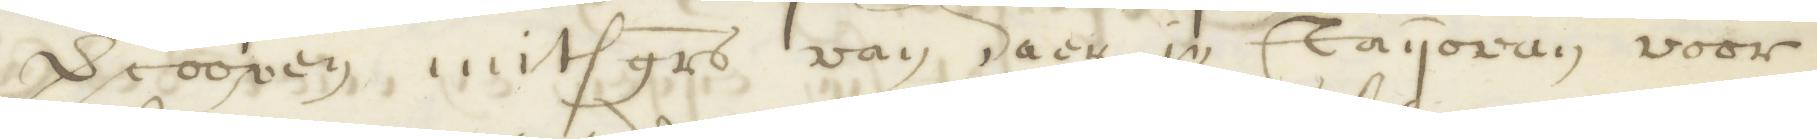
vercoopen mitsgrs van daer jn Taijovan voor
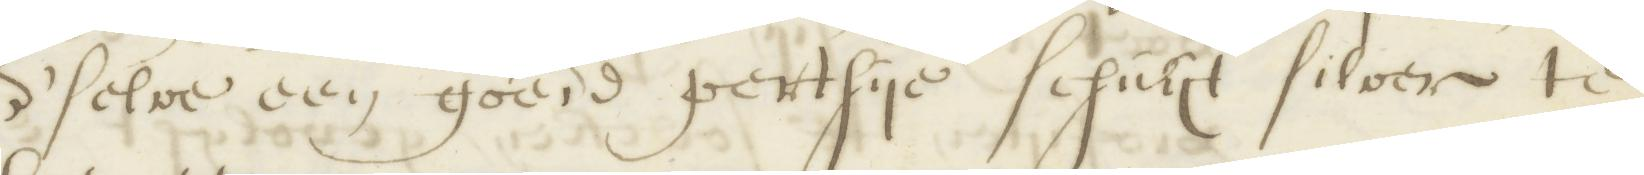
d' selve een goede perthije schuijt silver te
